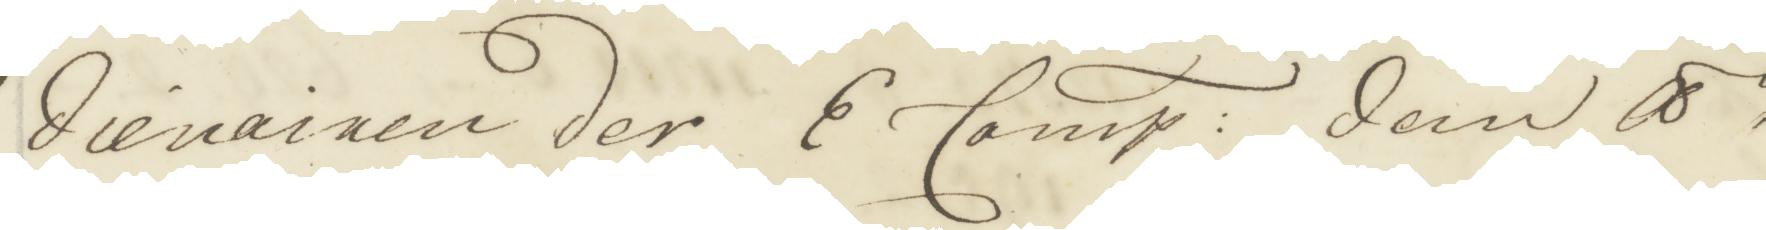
dienairen der E Comp: dan A„o
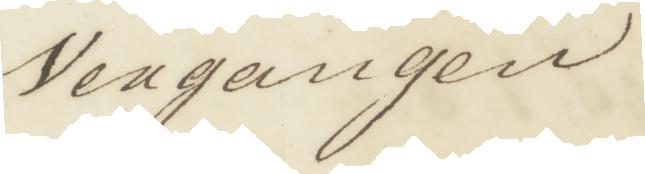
Vergangen
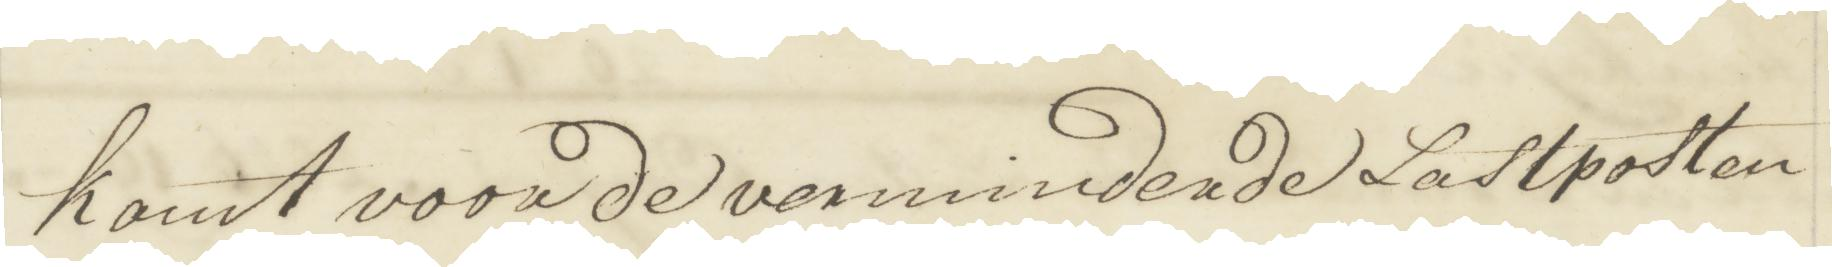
komt voor de verminderde Lastposten
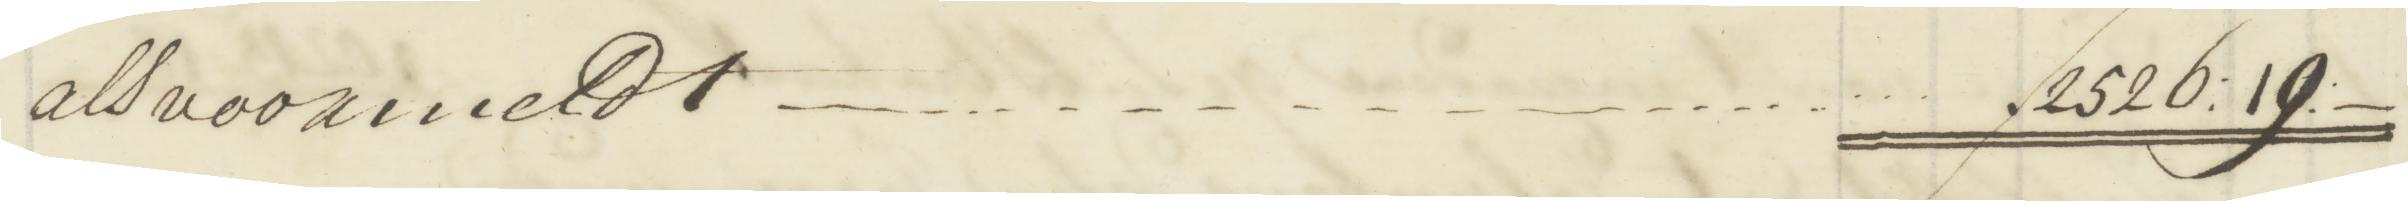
als voormeldt - - - - - - - - - - - - - - - - - - - - ƒ 2526: 19: —
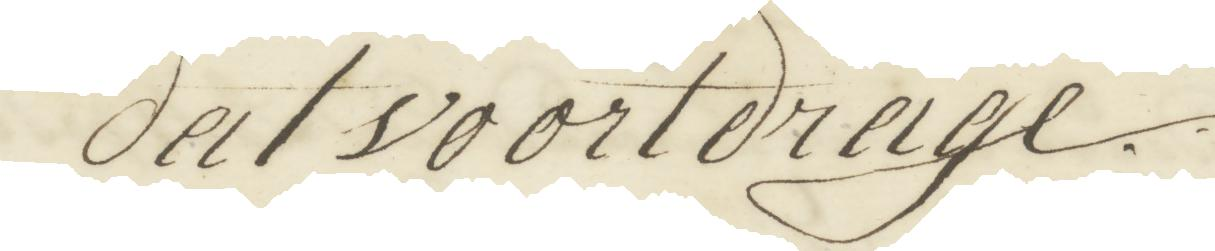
dat voortdrage.
